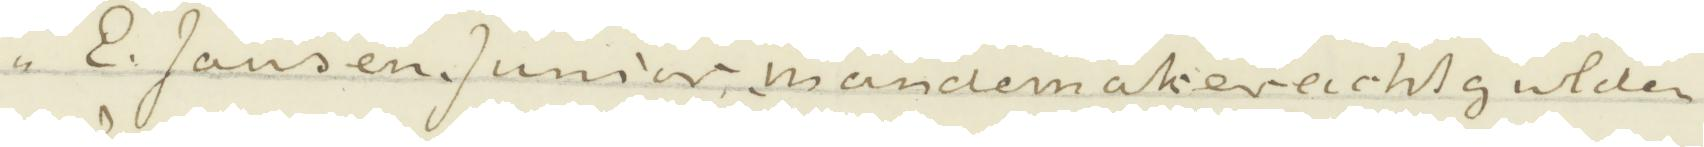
„ E. Jansen - Junior - mandemaker acht gulden
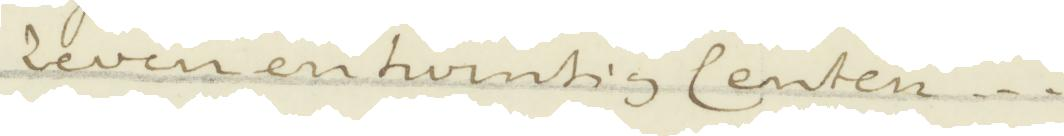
Zeven en twintig Centen
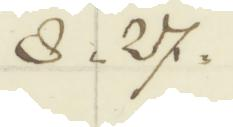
8 „ 27.
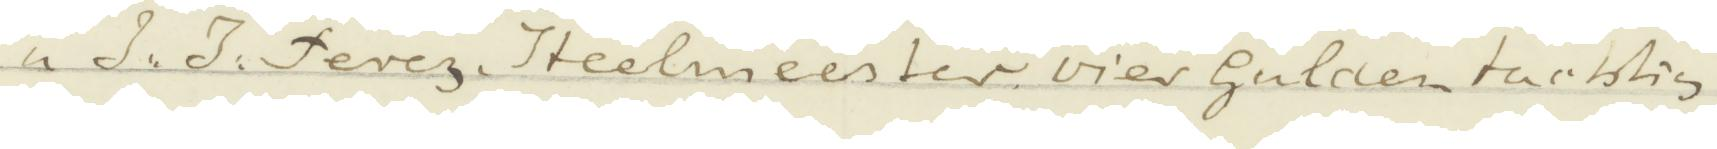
„ I: I: Perez, Heelmeester vier Gulden tachtig
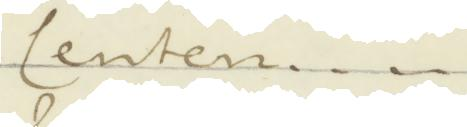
Centen - - - -
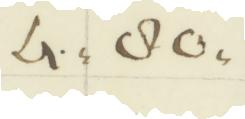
4. „ 80 „
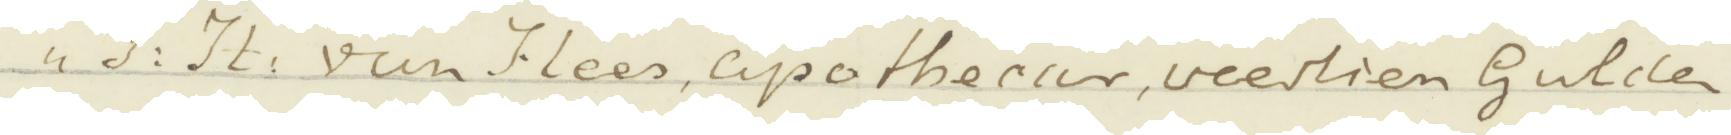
„ J: H: van Hees, apothecar, veertien Gulden
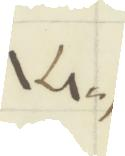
14 „
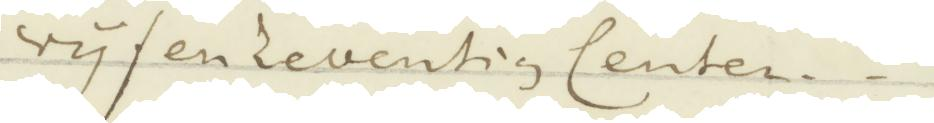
vijf en Zeventig Centen
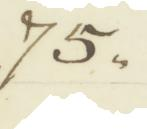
75„
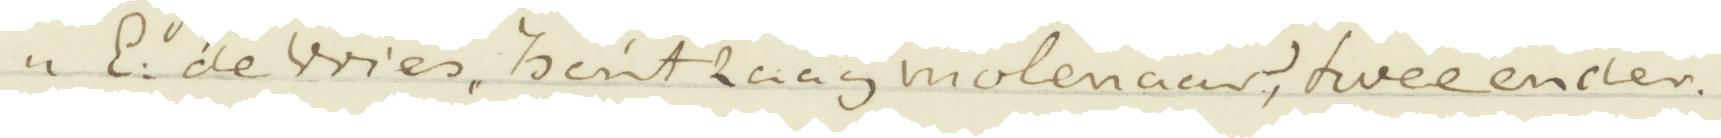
„ E: de Vries, houtzaagmolenaar, twee en der.
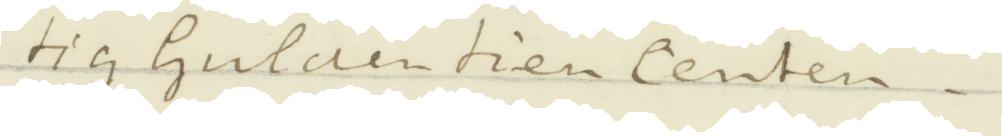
tig Gulden tien Centen
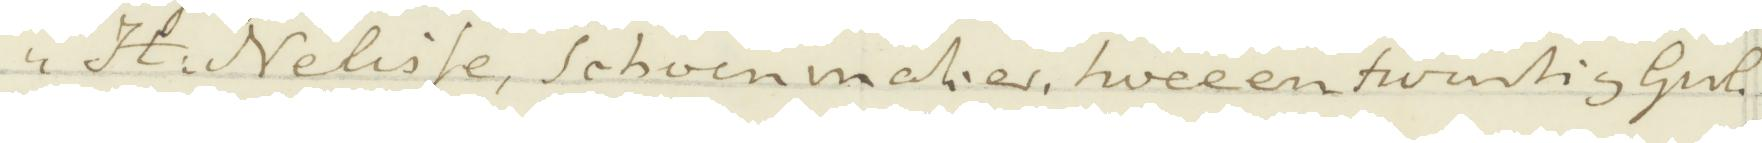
„ H: Nelisse, Schoenmaker, twee en twintig Gul.
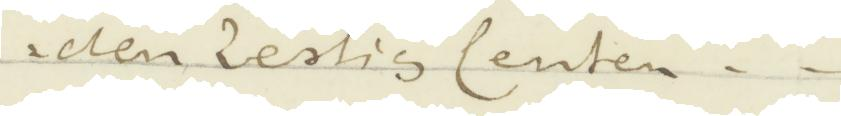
„den Zestig Centen - -
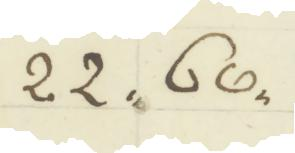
22 „ 60.
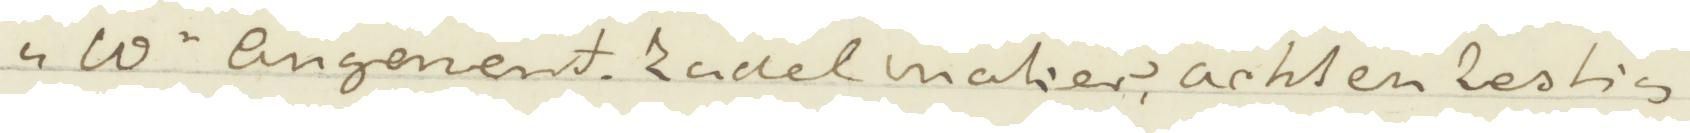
„ W:' Angenent Zadelmaker, acht en Zestig
